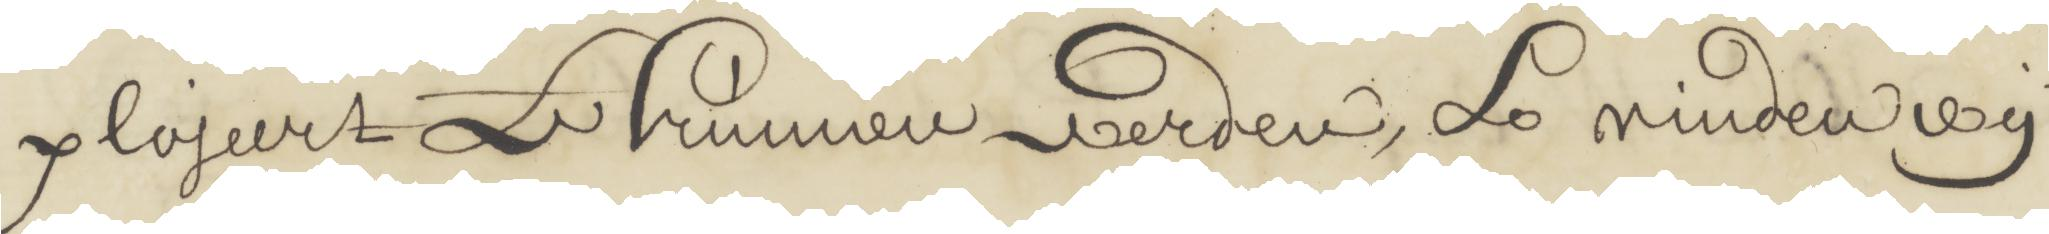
plojeert te kunnen werden, so vinden wij
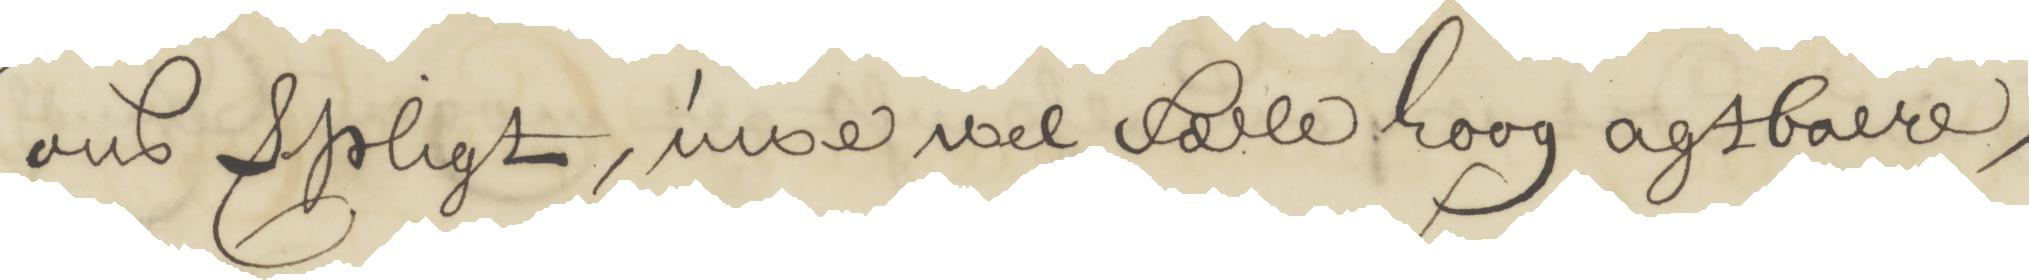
ons verpligt, uwe wel Edele hoog agtbaere,
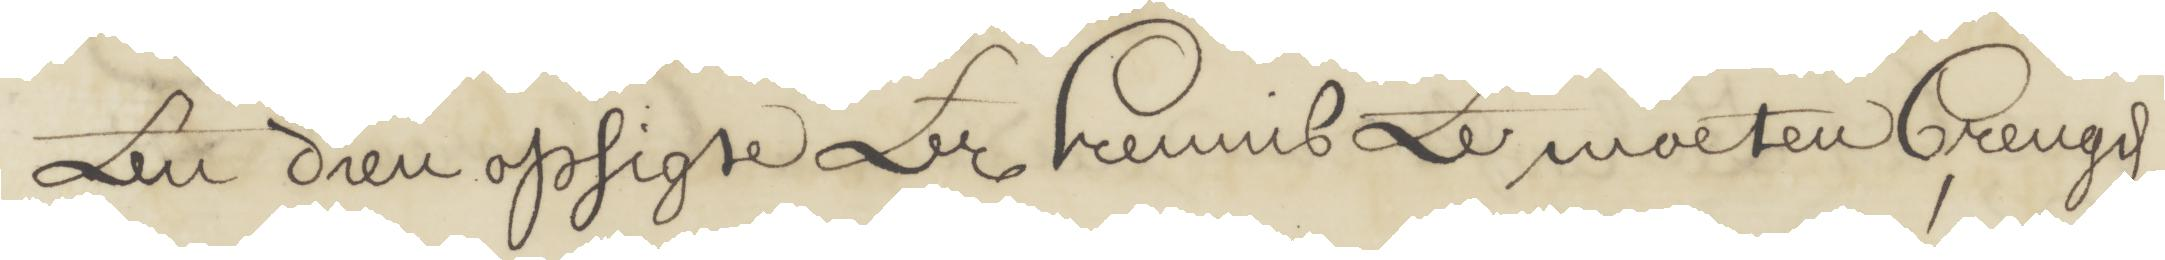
ten dien opsigte ter kennis te moeten brengen
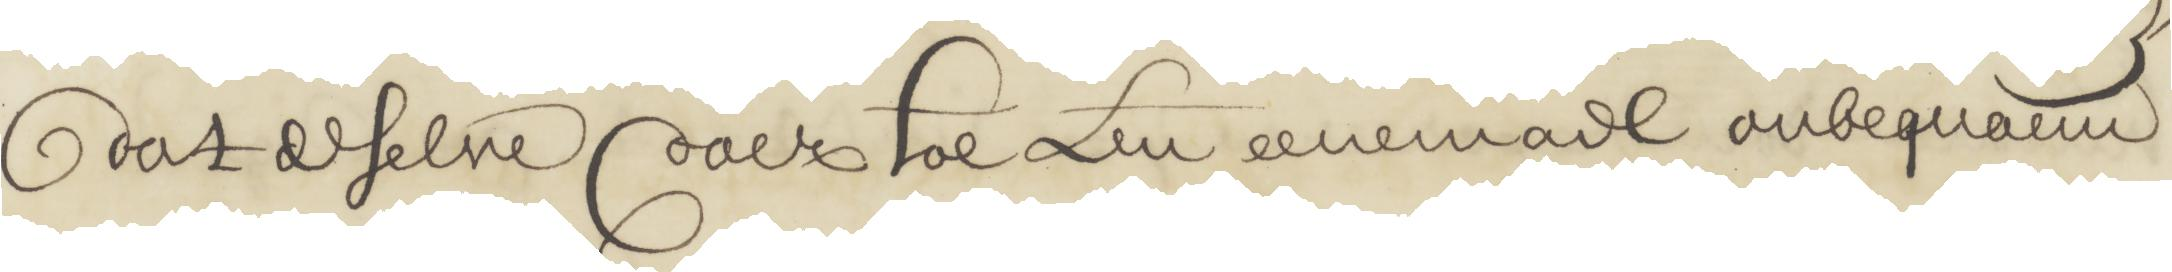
dat deselve daer toe ten eenemael onbequaem
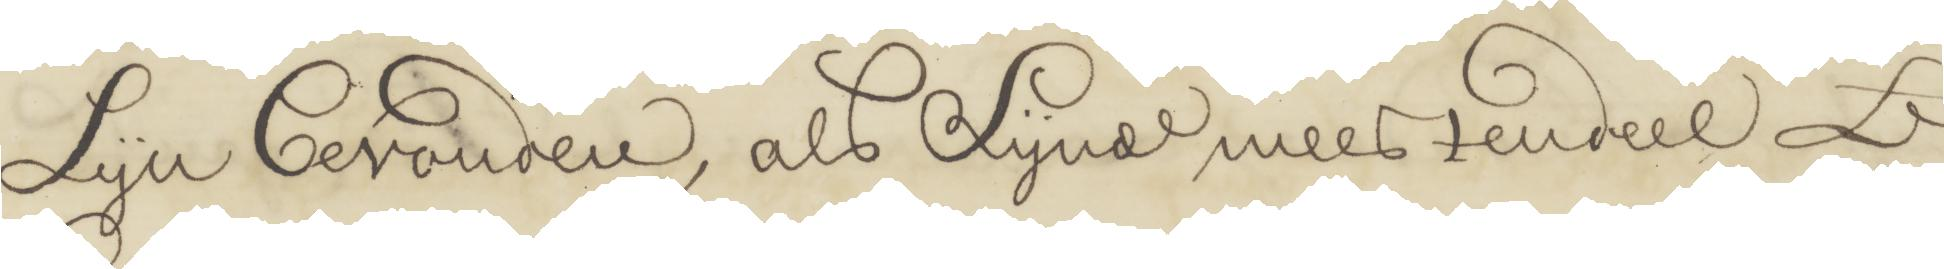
sijn bevonden, als sijnde meestendeel te
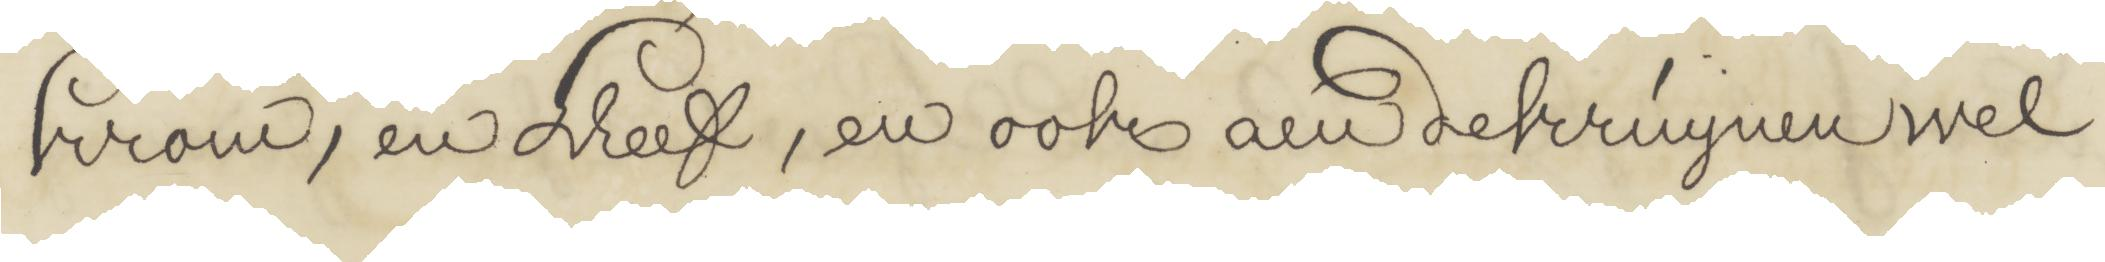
krom, en scheef, en ook aen de kruijnen wel
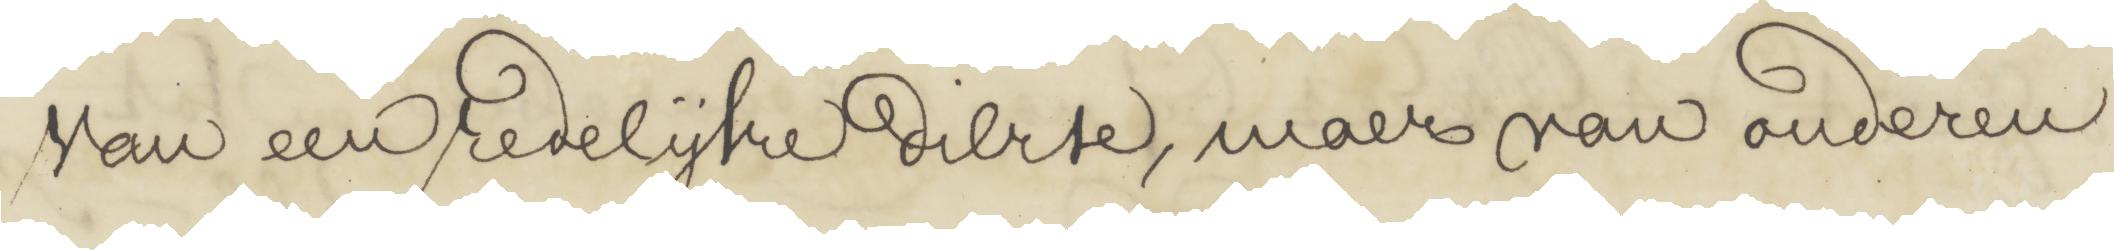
van een redelijke dikte, maer van onderen
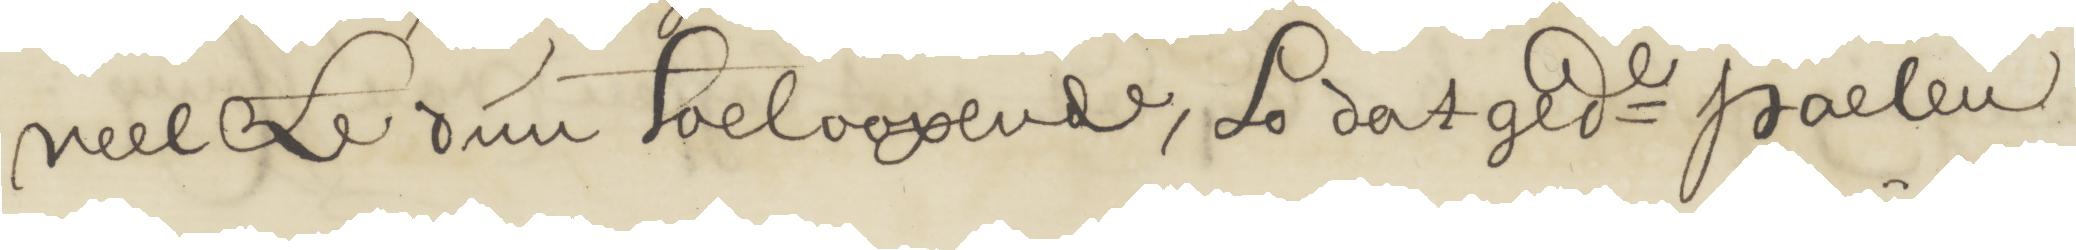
veel te dun toeloopende, so dat ged=e paelen
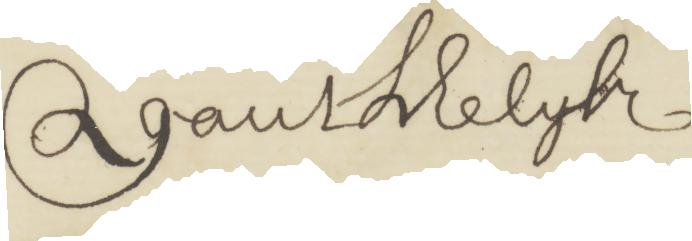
gantschelijk
